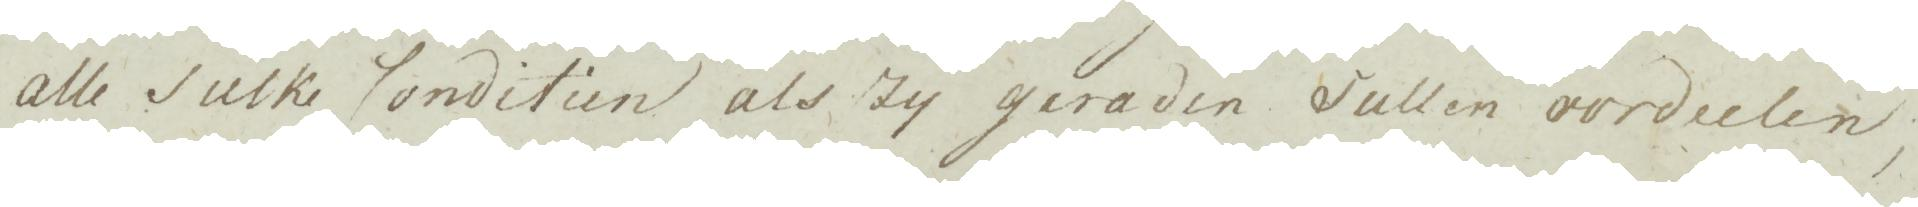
alle sulke Conditien als zy geraden sullen oordeelen,
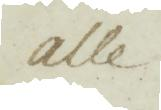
alle
